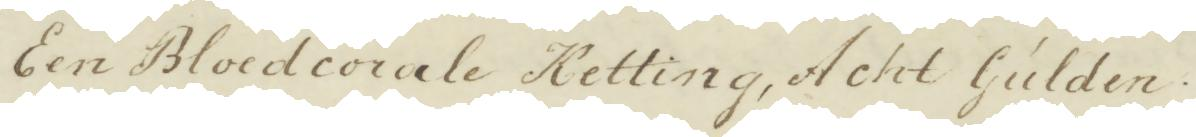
Een Bloedcorale Ketting, Acht Gulden.
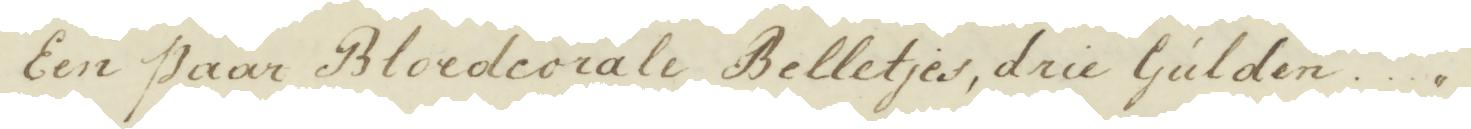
Een paar Bloedcorale Belletjes, drie Gulden . . . „
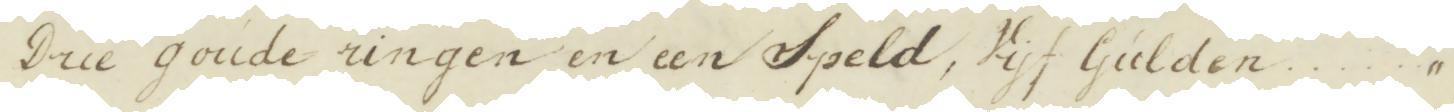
Drie goude ringen en een speld, Vijf Gulden . . . . . . „
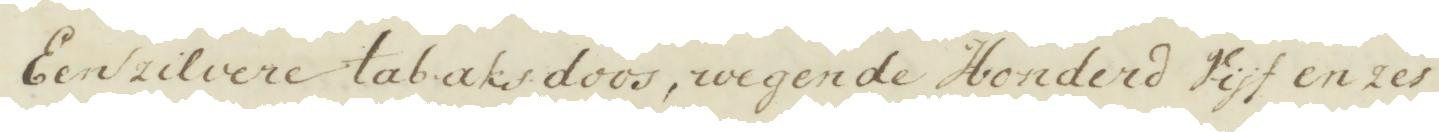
Een zilvere tabaksdoos, wegende Honderd Vijf en zes
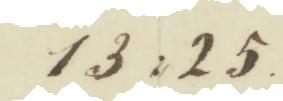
13:25.
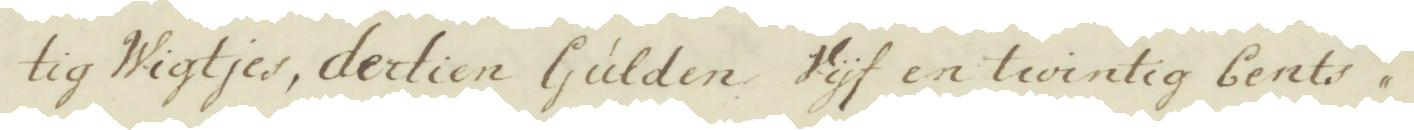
tig wigtjes, dertien Gulden Vijf en twintig Cents„
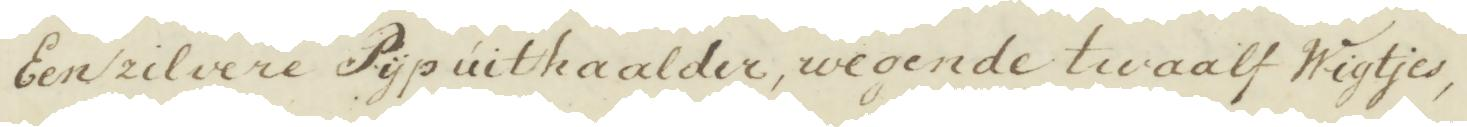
Een zilvere Pijpuithaalder, wegende twaalf wigtjes,
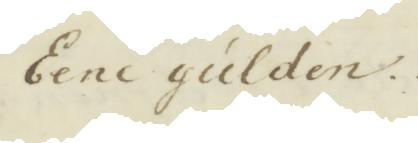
Eene gulden..
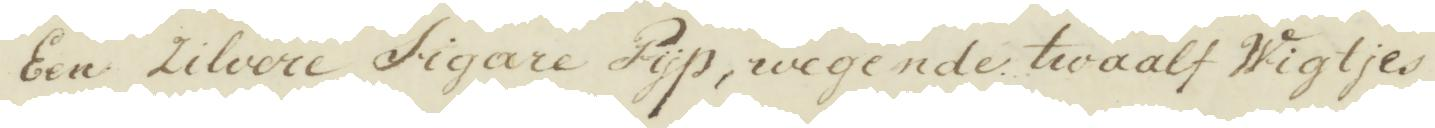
Een zilvere Sigare Pijp, wegende twaalf wigtjes
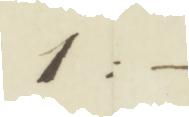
1:—
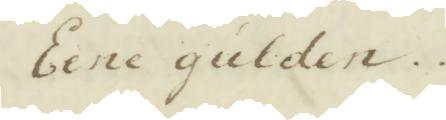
Eene gulden . .
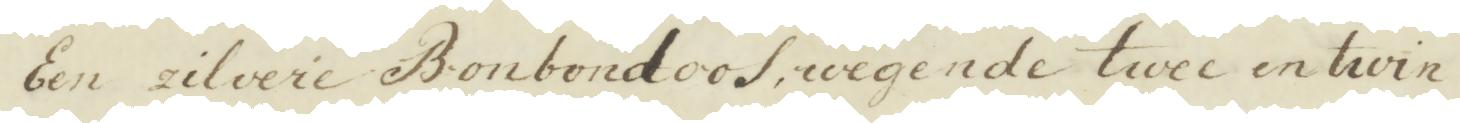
Een zilvere Bonbondoos, wegende twee en twin
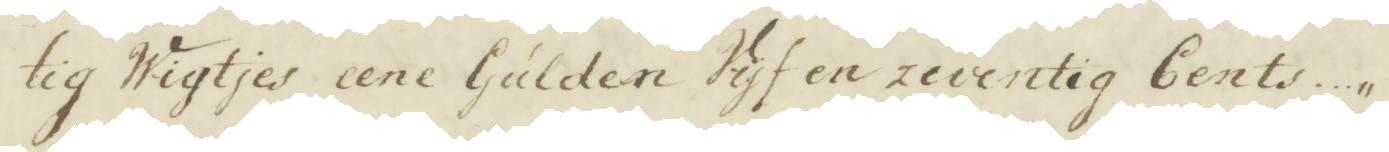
tig wigtjes eene Gulden Vijf en zeventig Cents . . . „
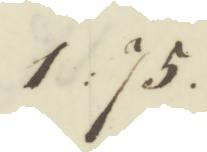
1:75.
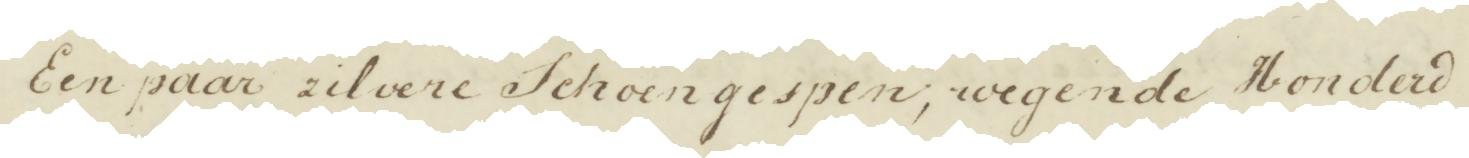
Een paar zilvere schoengespen, wegende Honderd
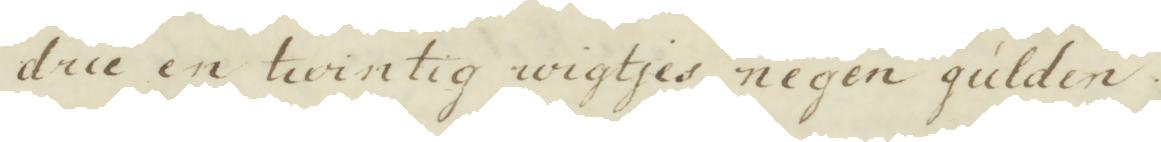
drie en twintig wigtjes negen gulden.
